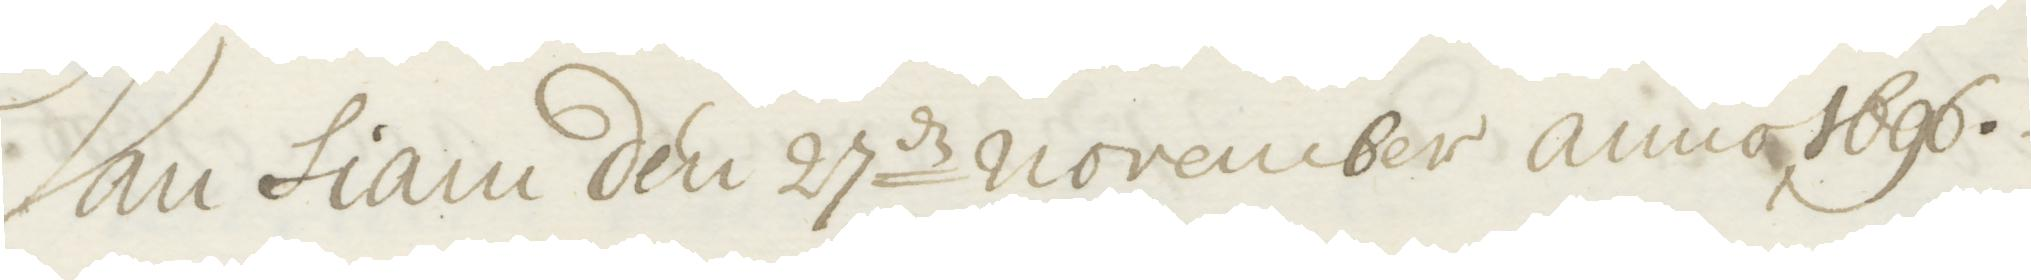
Van siam den 27=en november anno 1696.
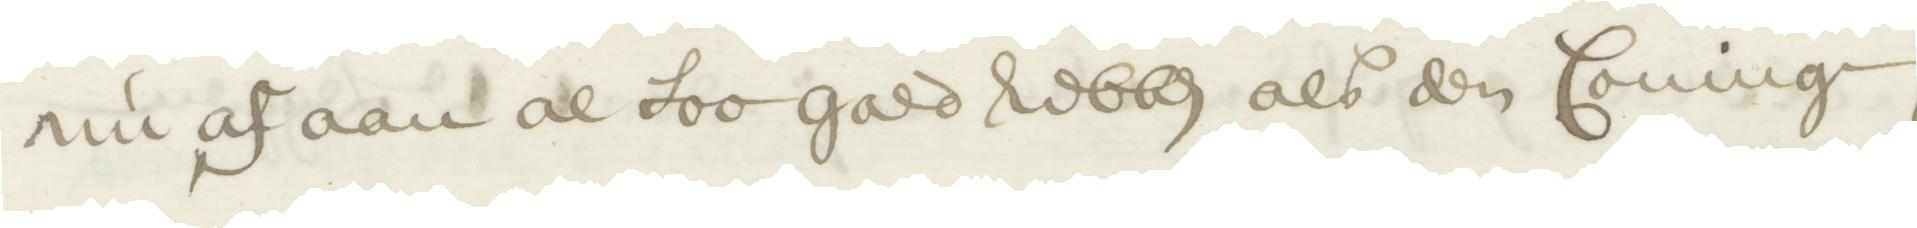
nu af aan al soo goed hebben als den Coning
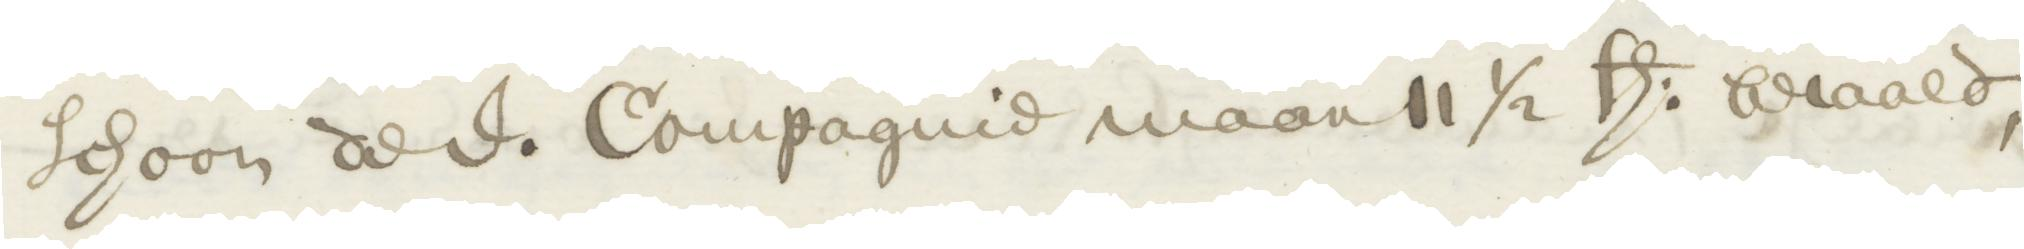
schoon de E. Compagnie maar 11½ th: betaald
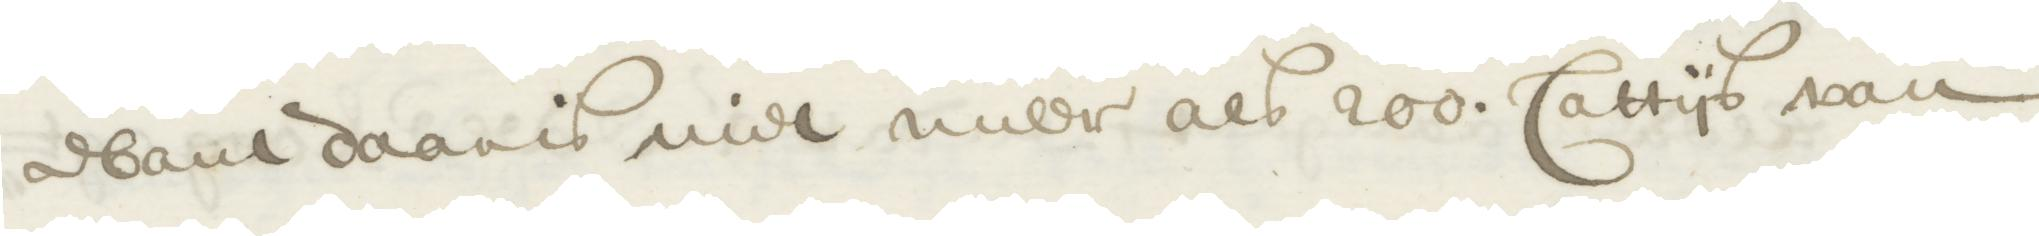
want daar is niet meer als 200. Cattijs van
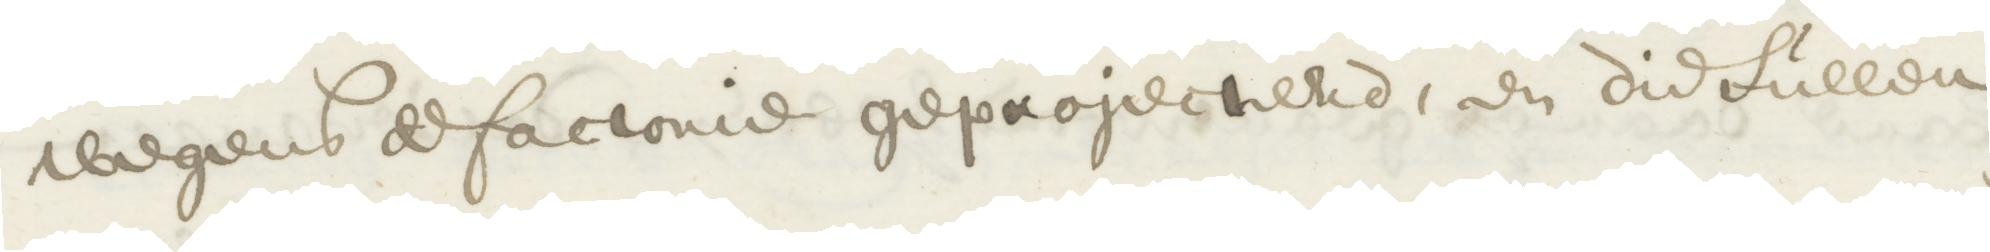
wegens de factorie geprojecteerd, en die sullen
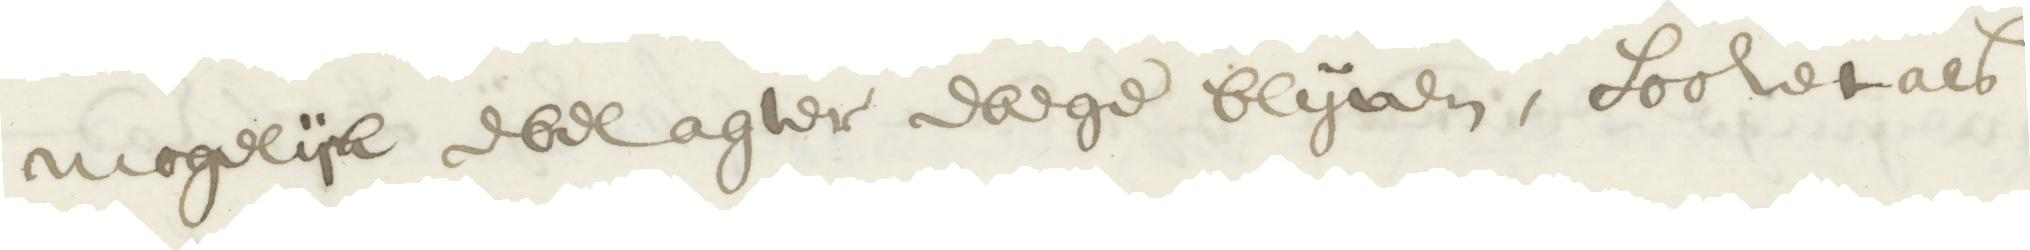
mogelijk deel agter wege blijven, soo het als
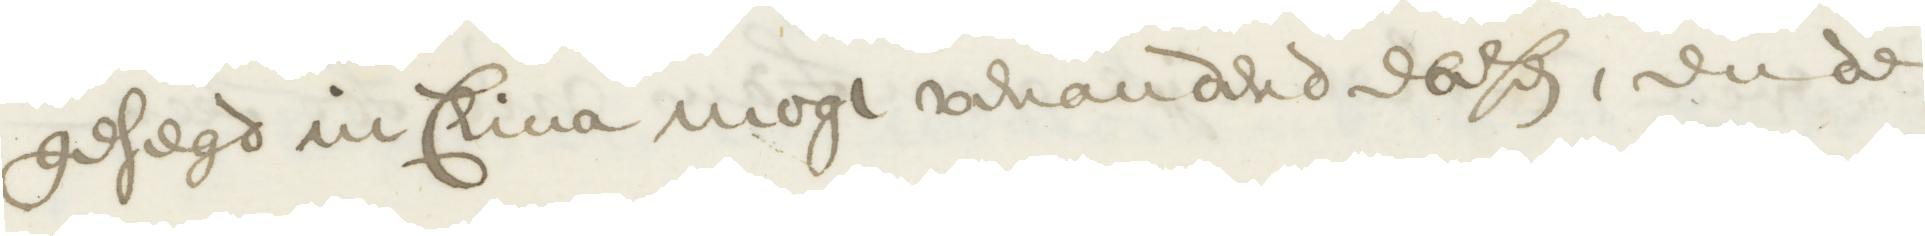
gesegd in China mogt veranderd wesen, en de
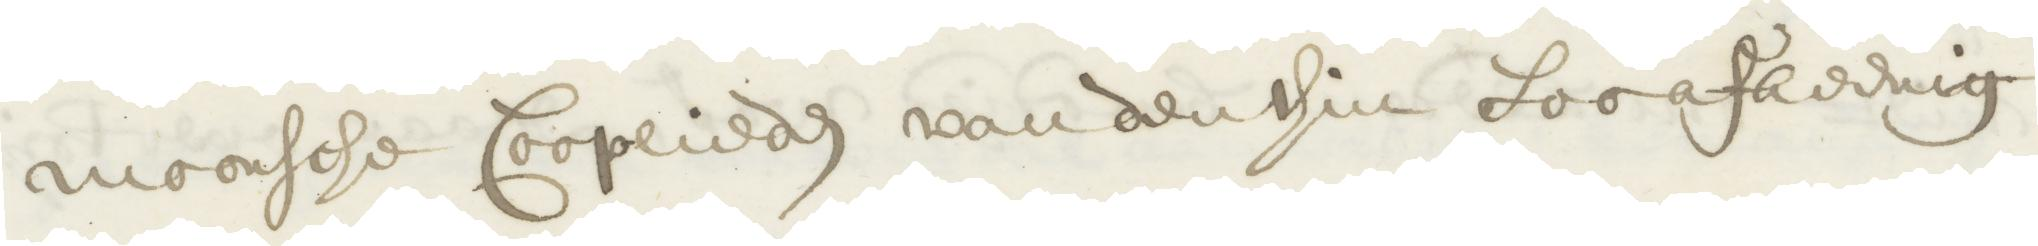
moorsche Cooplieden van den thin soo afkeerig
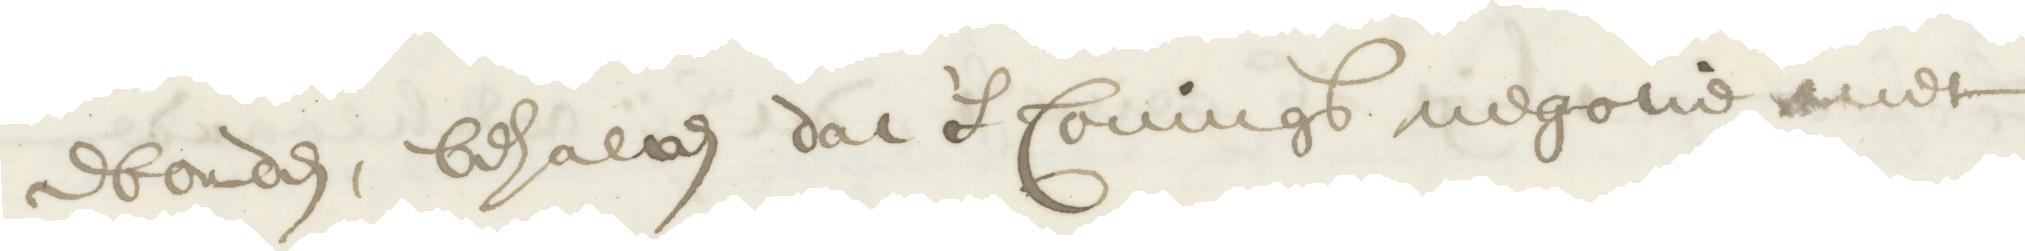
worden, behalven dat 'S Conings negotie met
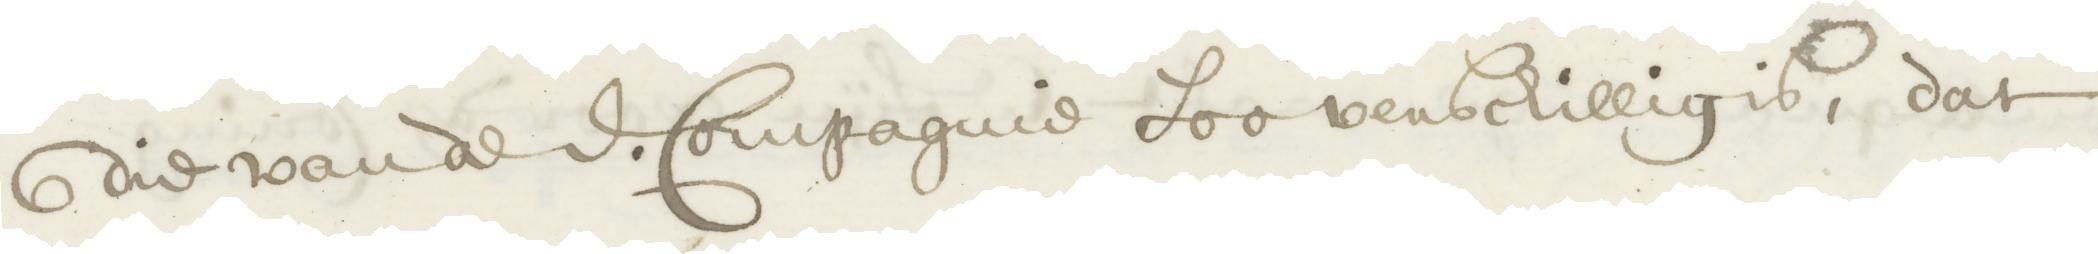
die van de E. Compagnie soo verschillig is, dat
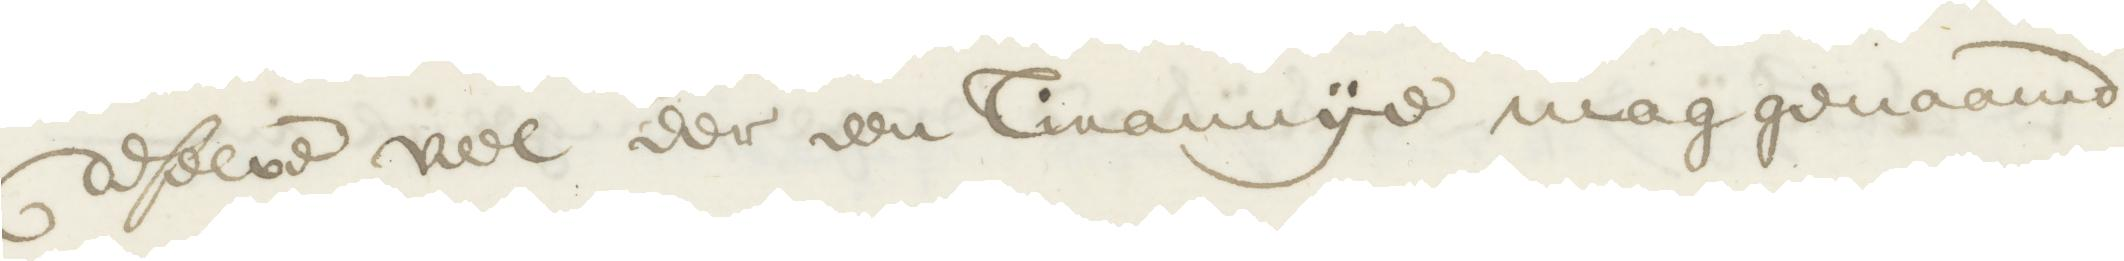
deselve veel eer een Tirannije mag genaamd
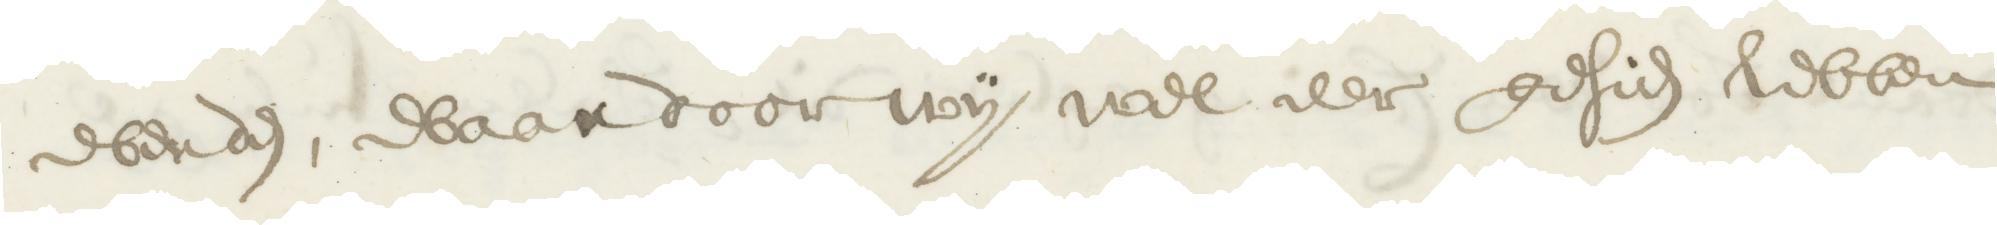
werden, waardoor wij wel eer gesien hebben
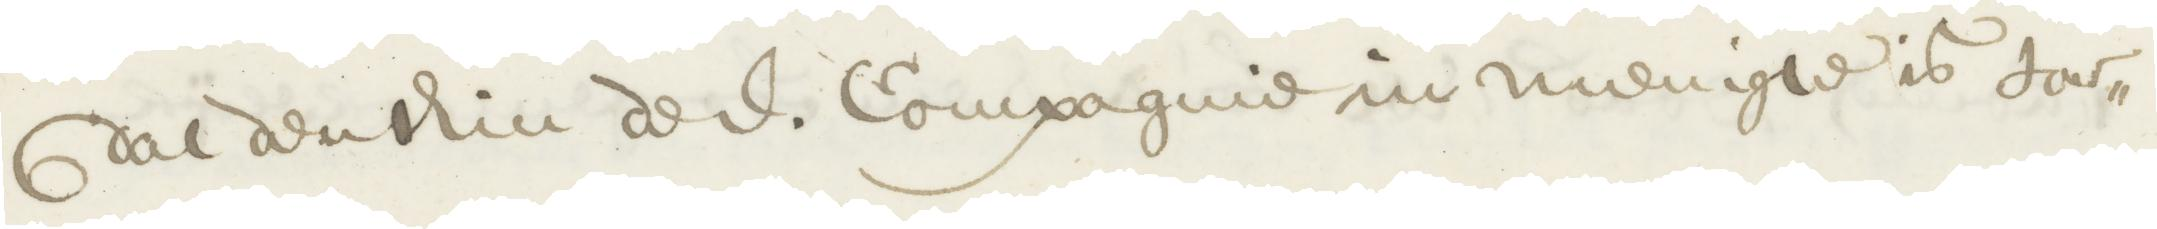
dat den thin de E: Compagnie in menigte is toe„
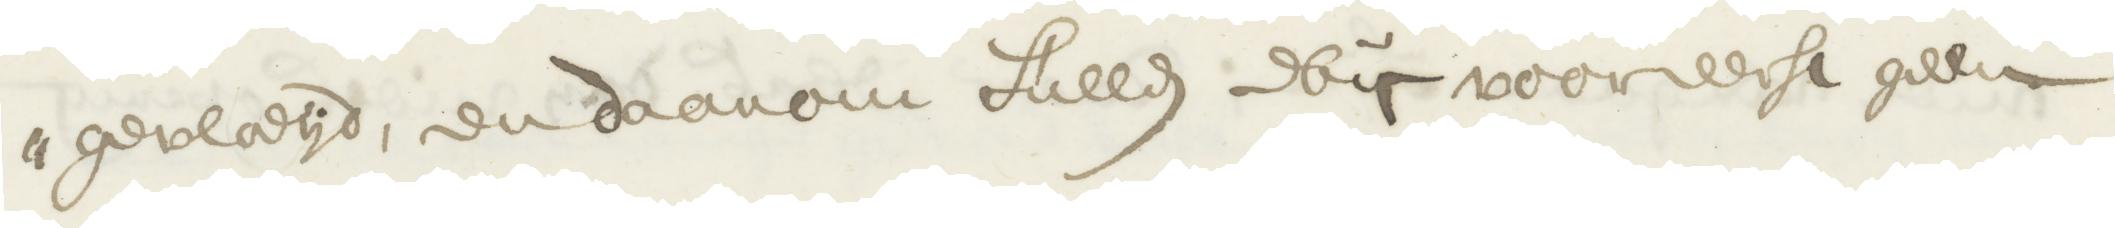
„gevloeijd, en daarom sullen wij vooreerst geen
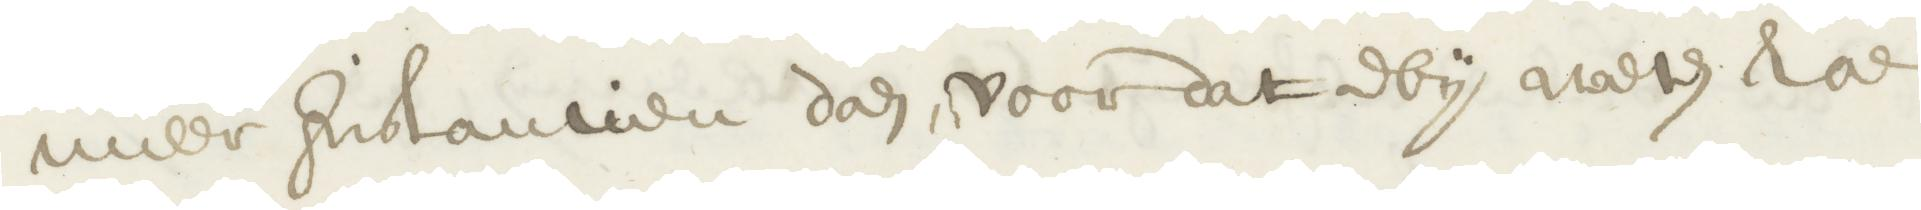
meer jnstantien doen, voor dat wij weten hoe
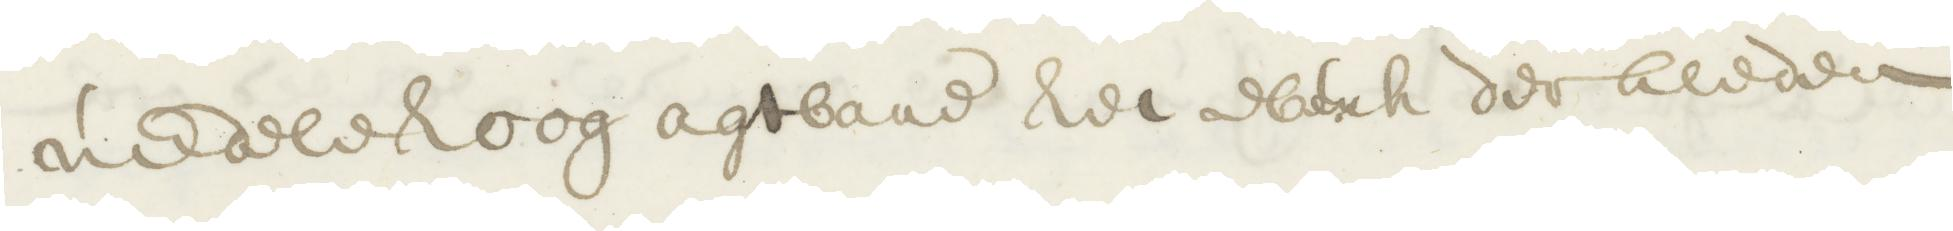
u Edele hoog agtbare het werk der kleden
